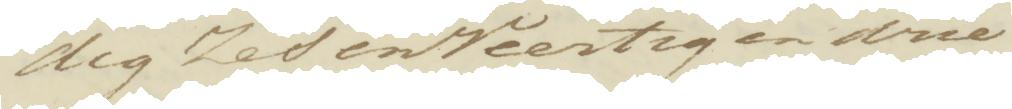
dig Zes en Veertig en drie
